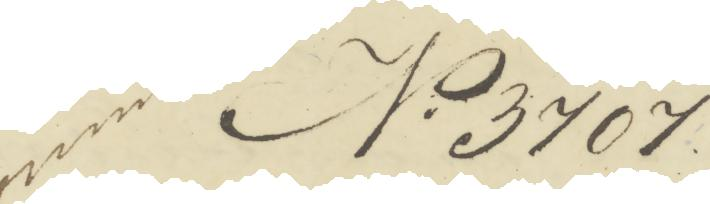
N.o 3707.
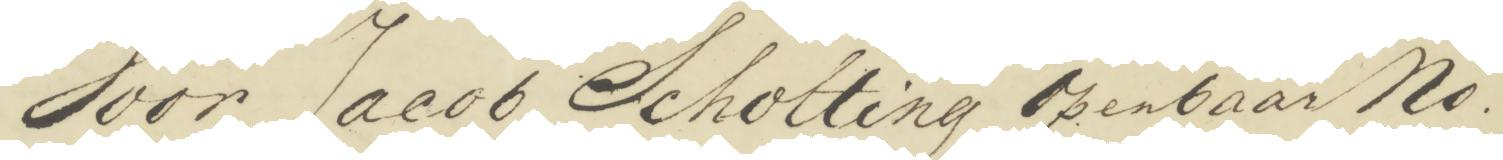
Voor Jacob Scholting openbaar No.
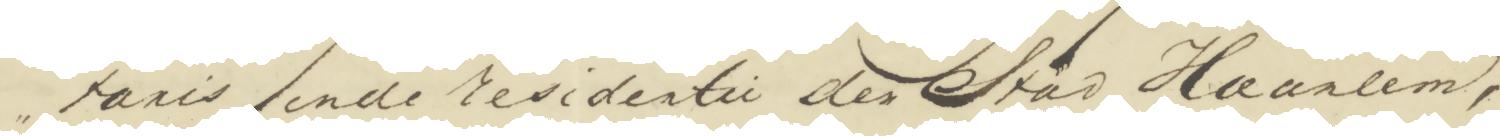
„taris inde residentie des Stad Haarlem,
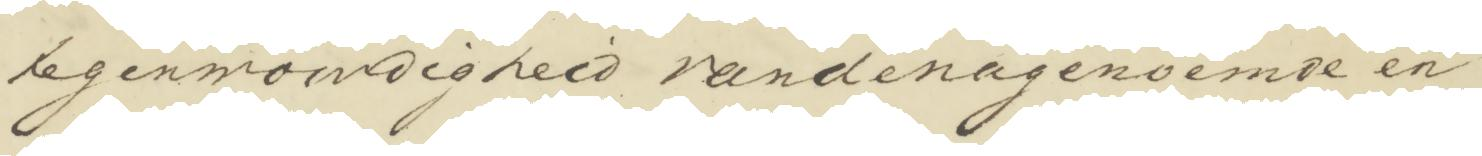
tegenwoordigheid van de nagenoemde en
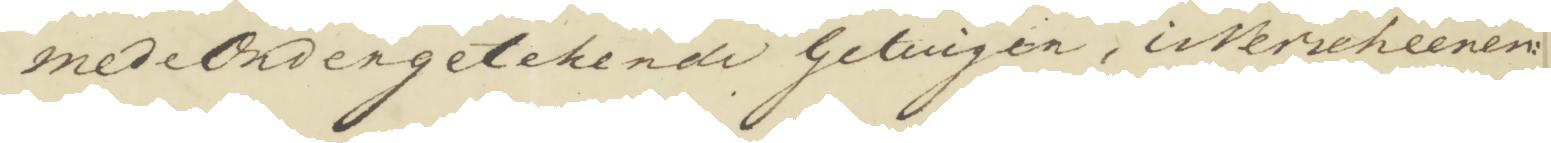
mede Ondergetekende getuigen, is verscheenen
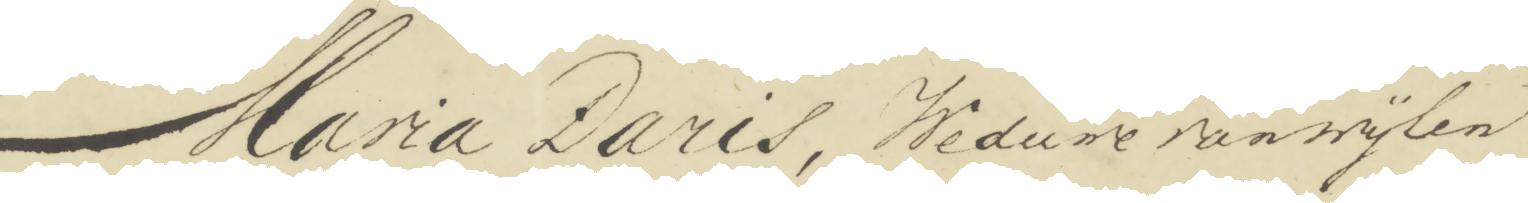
Maria Daris, Weduwe van wijlen
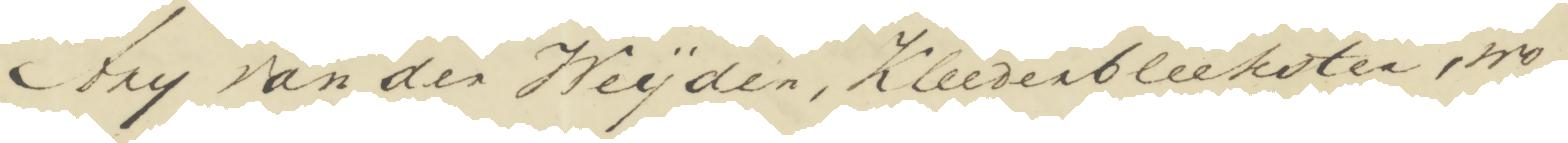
Ary van der Weijder, Kleederbleekster, wo
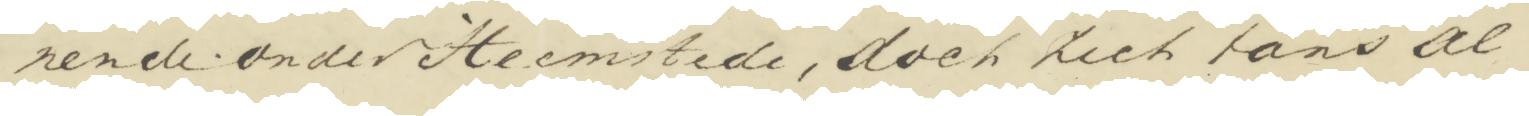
nende onder Heemstede, doch zich tans al
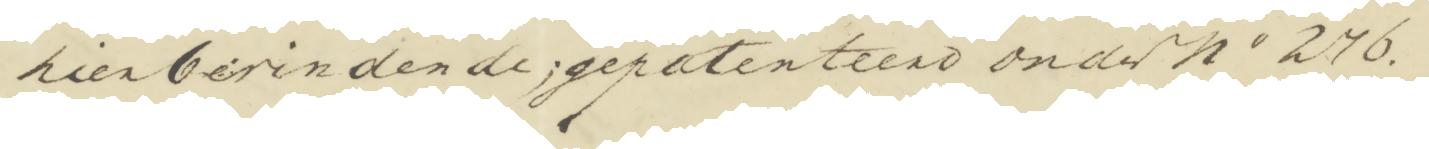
hier bevindende; gepatenteerd onder No 276.
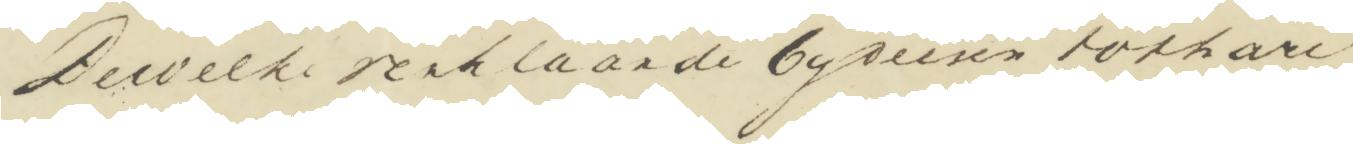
Dewelke verklaarde by deesen tot hare
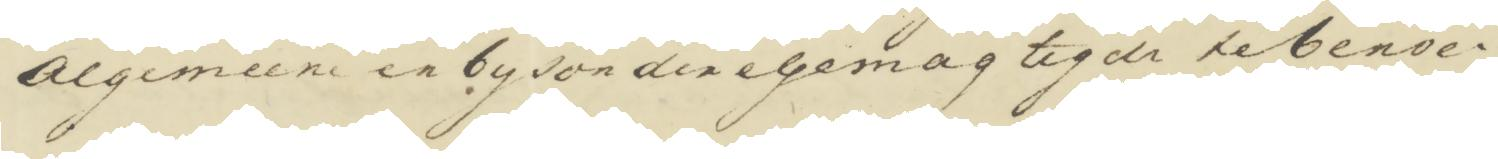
algemeene en bysondere gemagtigde te benoe
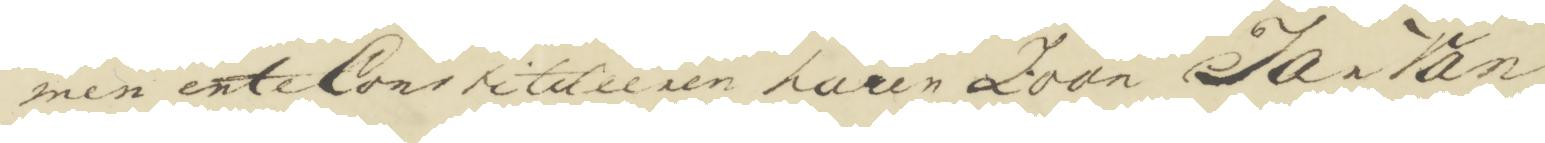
men en te constitueeren haren zoon Jan Van
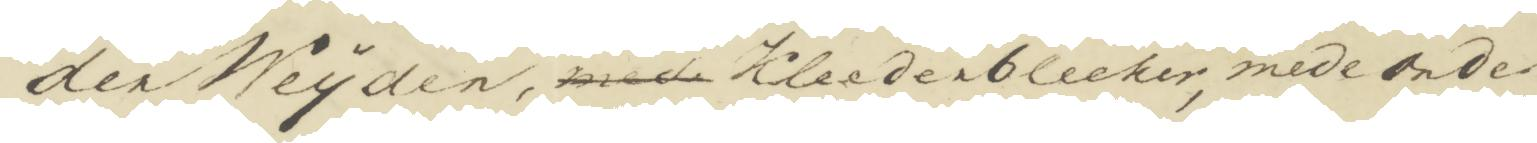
der Weijden, mede Kleederbleeker, mede onder
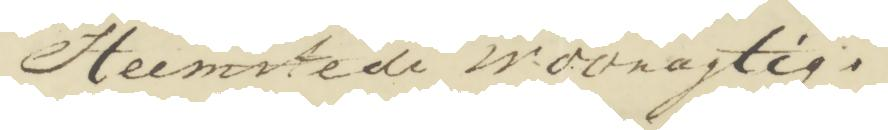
Heemstede Woonagtig.
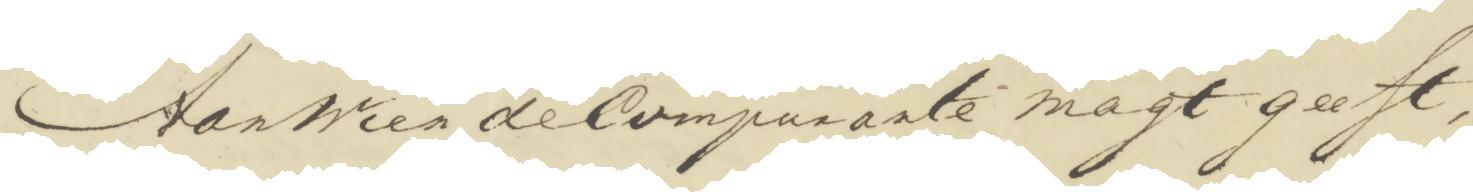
Aan wien de comparante magt geeft,
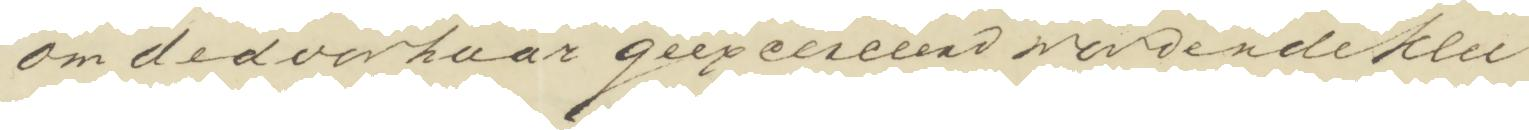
om de door haar geëxcerceerd wordende klee
